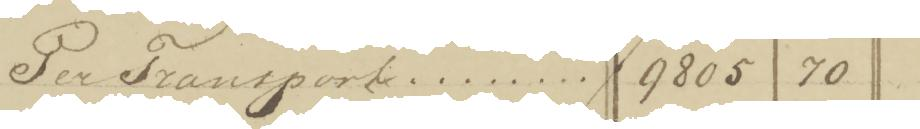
Per Transport . . . . . . . . . ƒ 9805 70
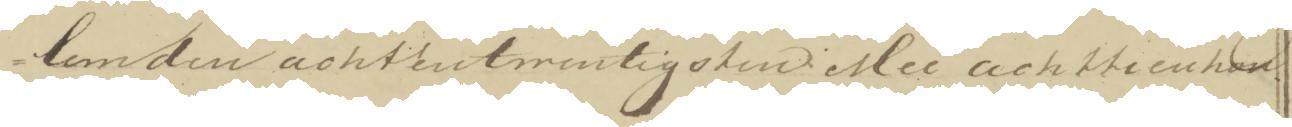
=lem den acht entwintigsten Mei achttien hon
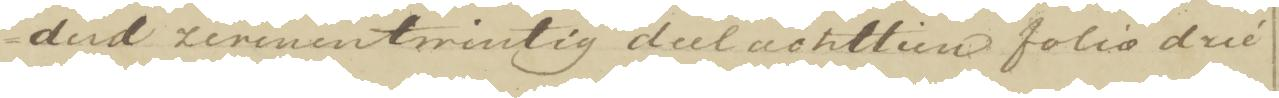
=derd zevenentwintig deel achttien folio drie
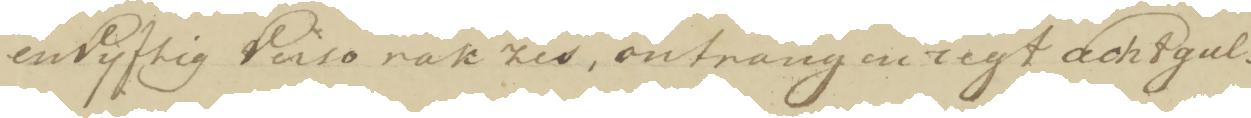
en Vyftig Verso vak zes, ontvangen regt acht gul„
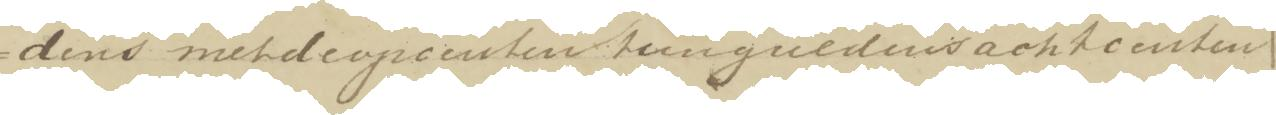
=dens met de opcenten tien guldens acht centen
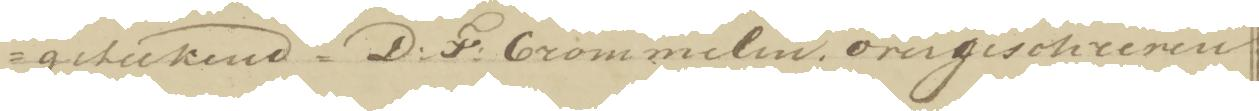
=geteekend = D: F: Crommelin, overgeschreven
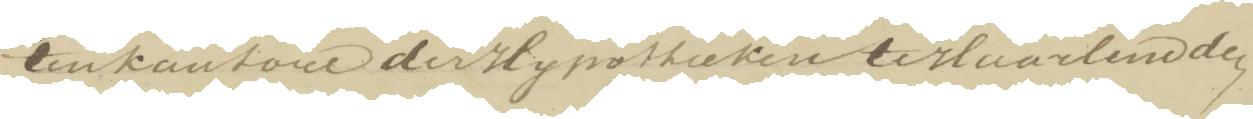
ten kantore der Hypotheeken te Haarlem den
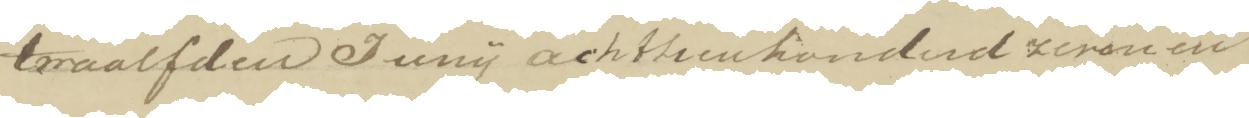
twaalfden Junij achttienhonderd zeven en
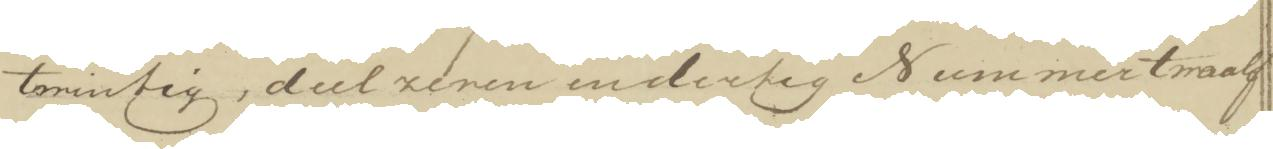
twintig, deel zeven en dertig Nummer twaalf
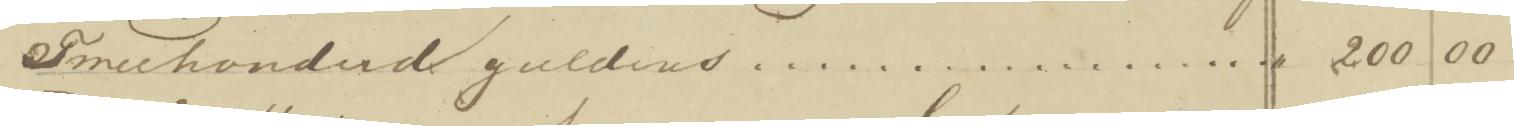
Tweehonderd guldens. . . . . . . . . . . . . . . . . . . „ 200 00
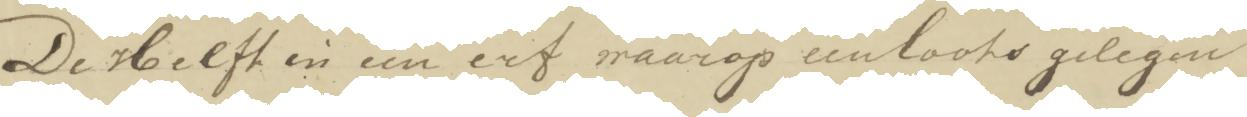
De Helft in een erf waarop een loots gelegen
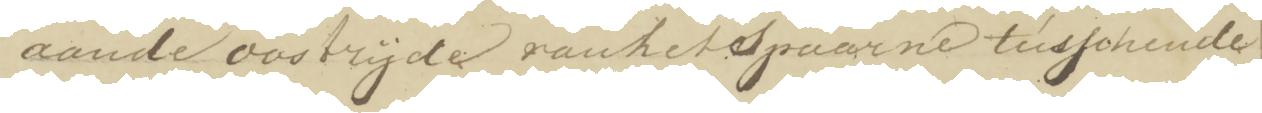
aan de oostzijde van het Spaarne tusschen de
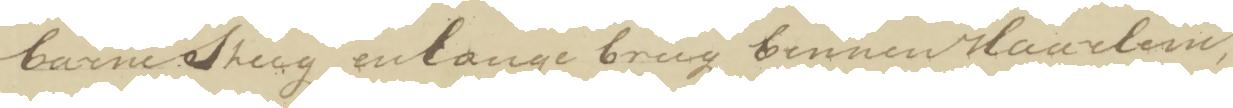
barnesteeg en lange brug binnen Haarlem,
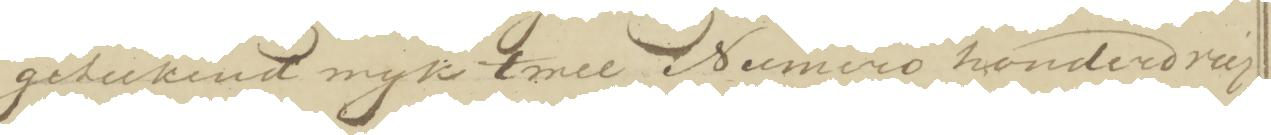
geteekend wyk twee Numero honderd vier
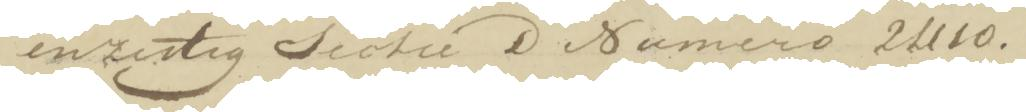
en zestig sectie D Numero 2410.
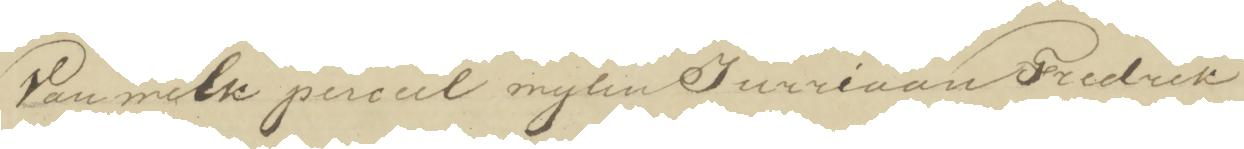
Van welk perceel wylen Jurriaan Fredrik
